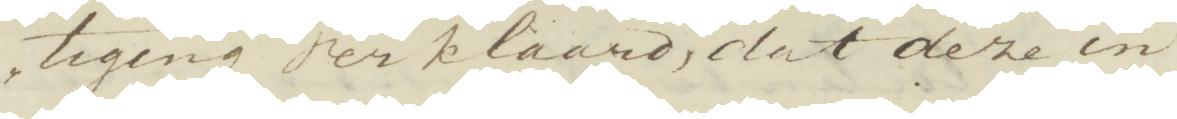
„tiging verklaard, dat deze in
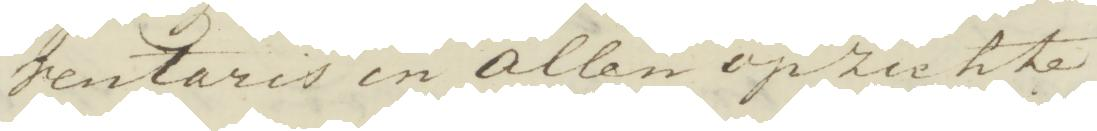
ventaris in allen opzichte
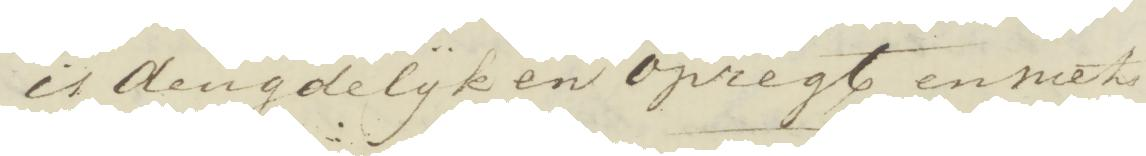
is deugdelijk en opregt en niets
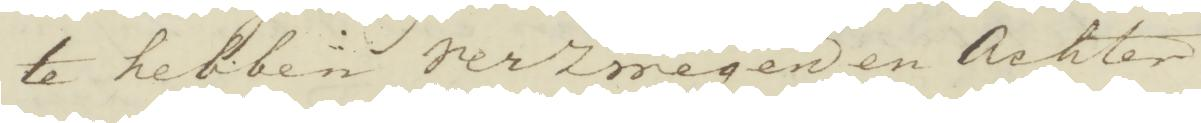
te hebben verzwegen en Achter
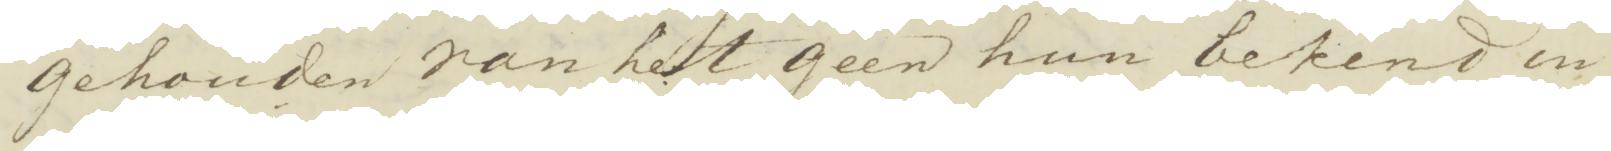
gehouden van het geen hun bekend in
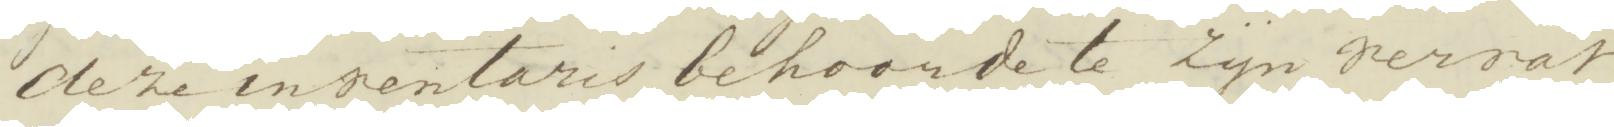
deze inventaris behoorde te zijn vervat
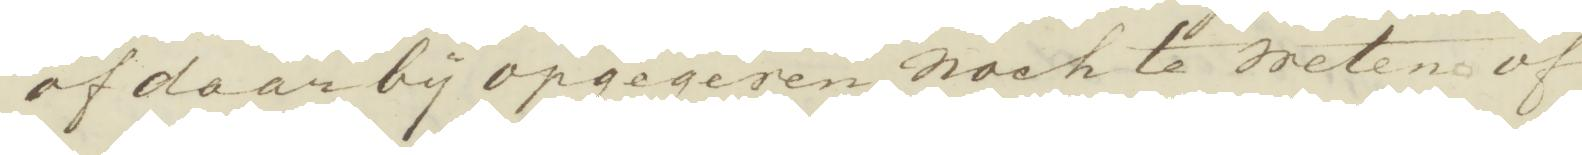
of daar bij opgegeven noch te weten of
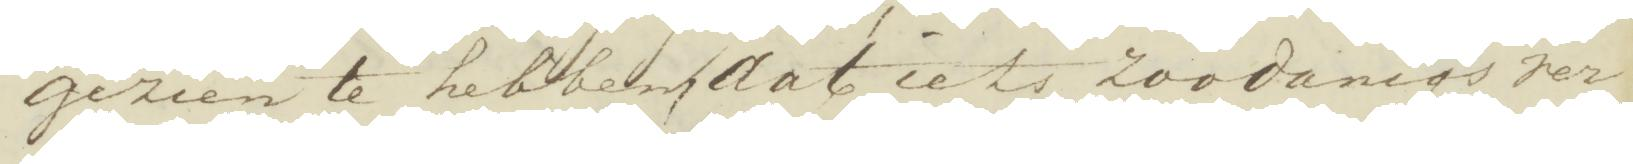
gezien te hebben, dat iets zoodanigs ver
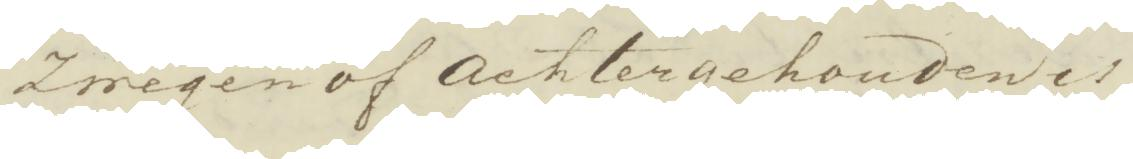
zwegen of achtergehouden is.
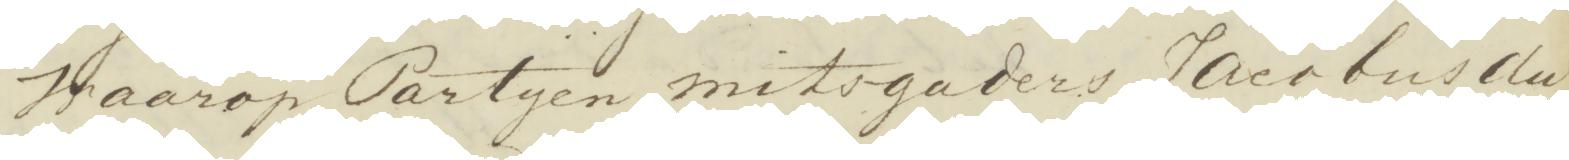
Waarop Partijen, mitsgaders Jacobus du
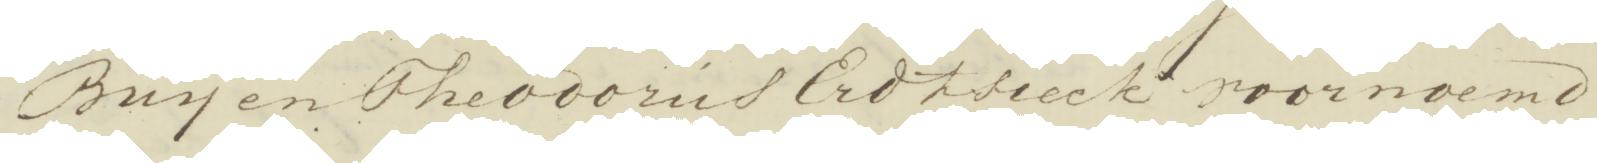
Buij en Theodorus Erdtsieck voornoemd
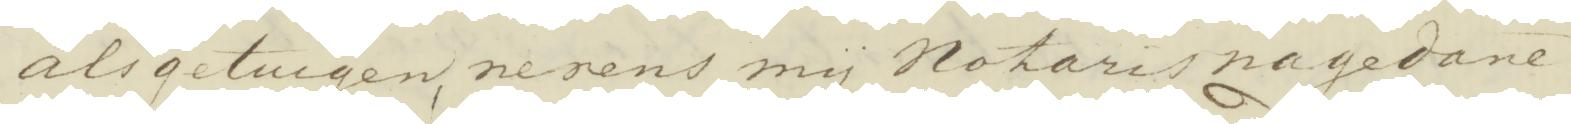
als getuigen, nevens mij Notaris na gedane
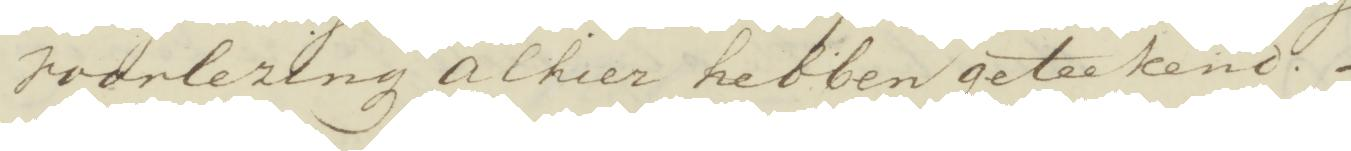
voorlezing alhier hebben geteekend.
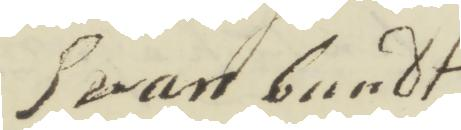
Ivan bundt
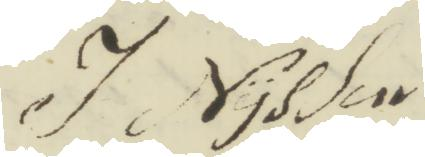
I Nijssen
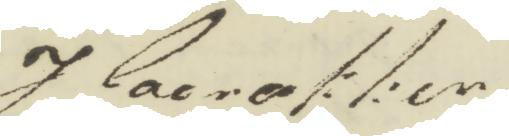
J laarakker
